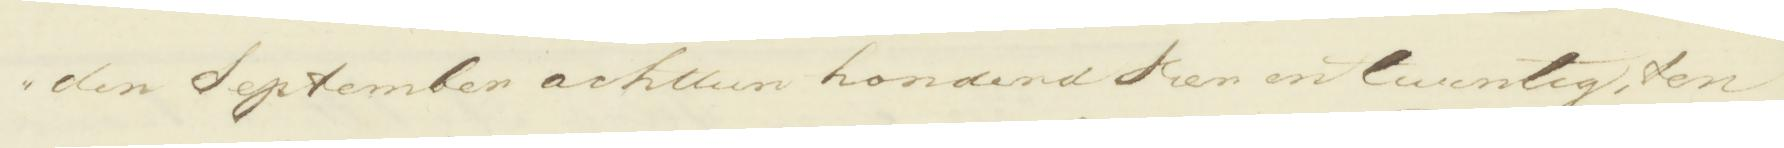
„den September achttien honderd Vier en twintig, ten
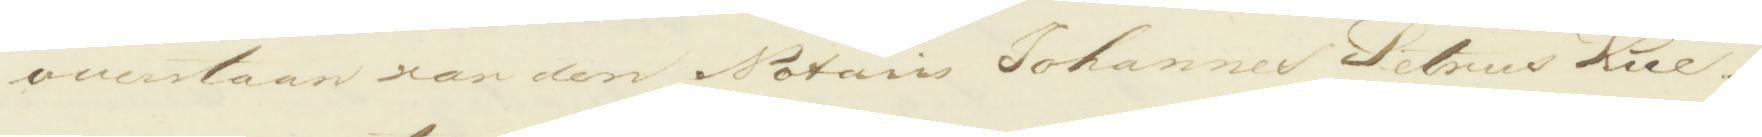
overstaan van den Notaris Iohannes Petrus Kue„
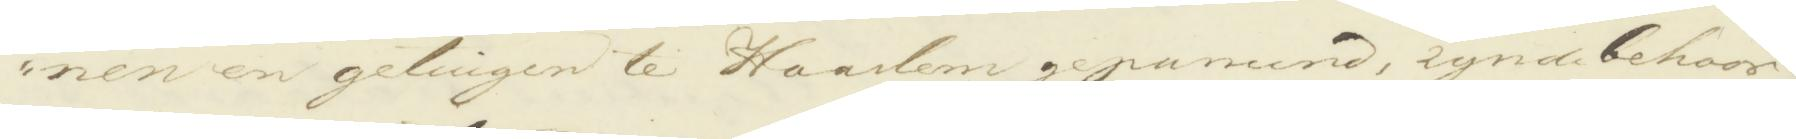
„nen en getuigen te Haarlem gepasseerd, zynde behoor
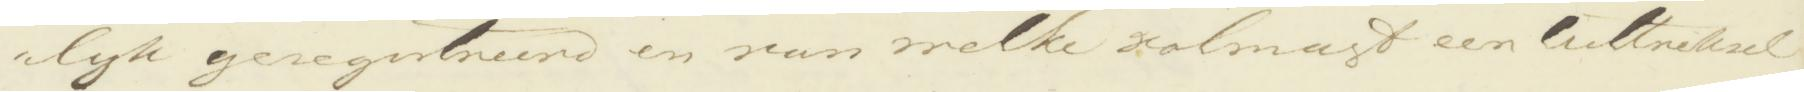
„lyk geregistreerd en van welke volmagt een uittreksel
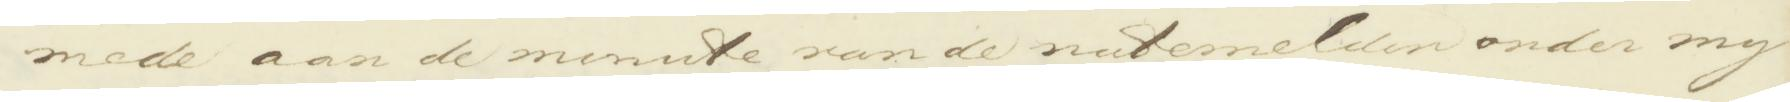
mede aan de minute van de natemelden onder my
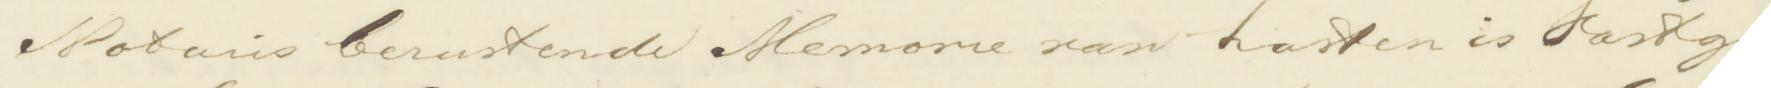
Notaris berustende Memorie van Lasten is Vastge
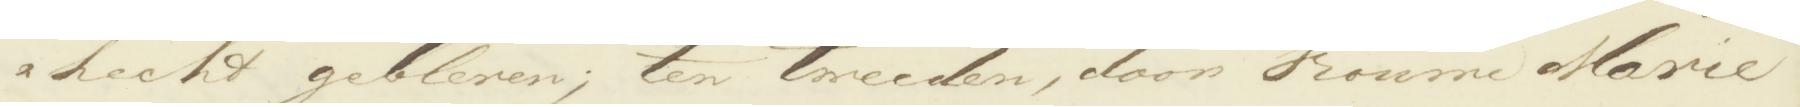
„hecht gebleven; ten tweeden, door Vrouwe Marie
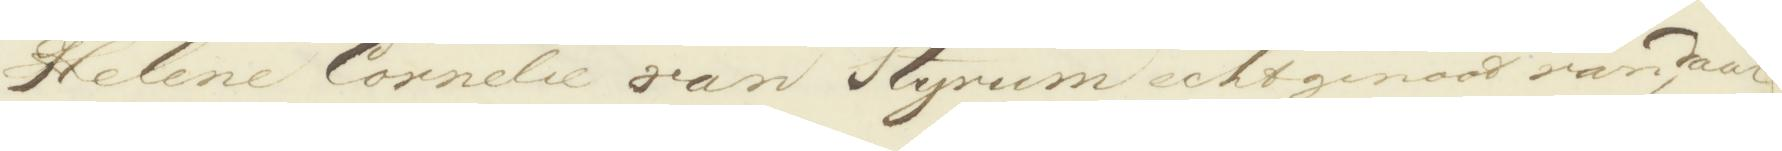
Helene Cornelie van Styrum echtgenoot van, daar
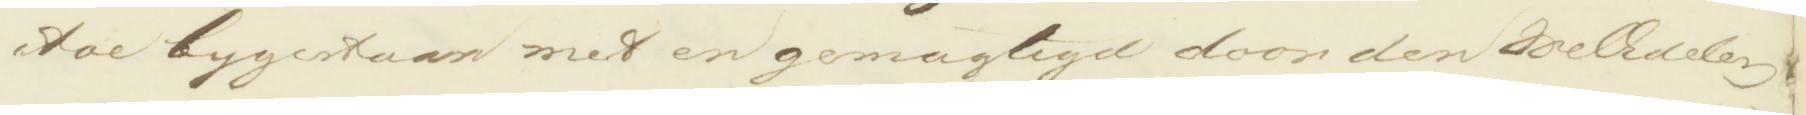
toe bygestaan met en gemagtigd door den WelEdelen
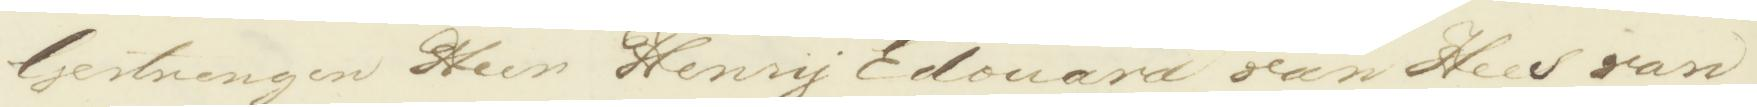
Gestrengen Heer Henrij Edouard van Hees van
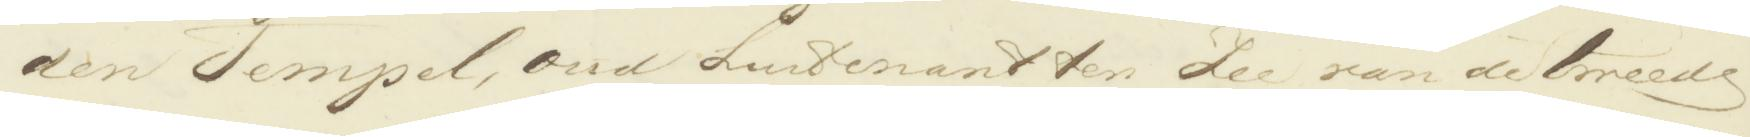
den Tempel, oud Luitenant ter Zee van de tweede
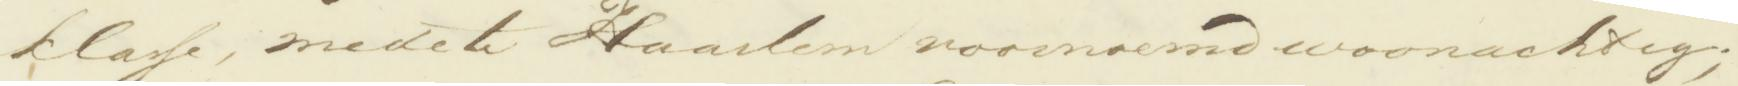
klasse, mede te Haarlem voornoemd woonachtig;
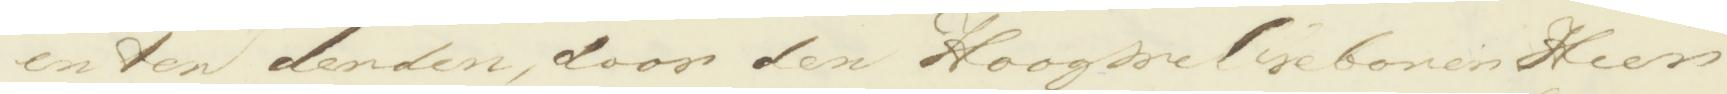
en ten derden, door den Hoogwelgeboren Heer
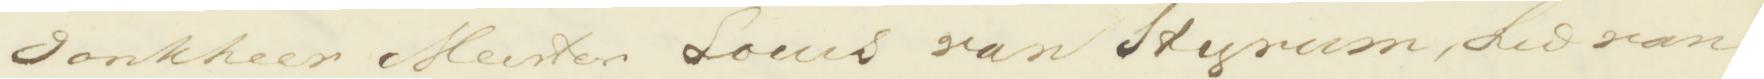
Ionkheer Meester Louis van Styrum, Lid van
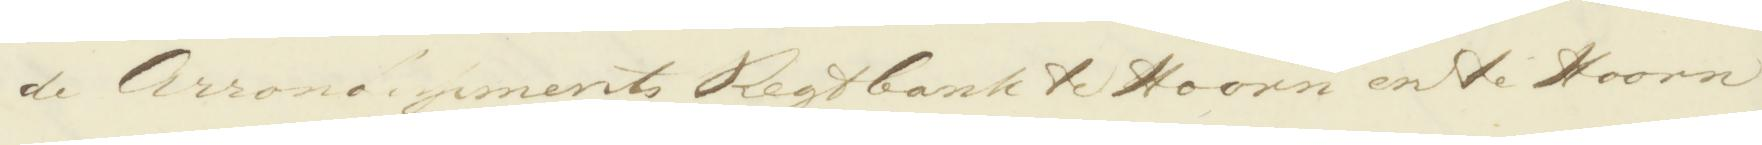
de Arrondissement Regtbank te Hoorn en te Hoorn
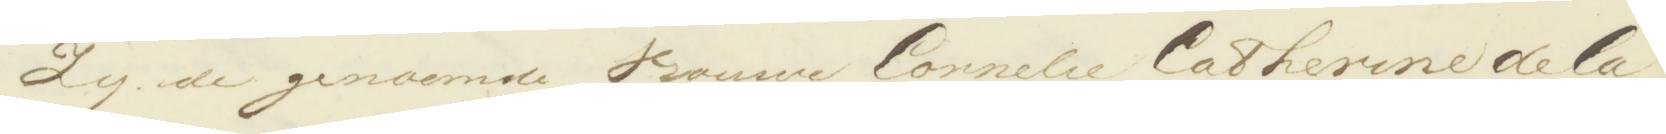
Zynde genoemde Vrouwe Cornelie Catherine de la
